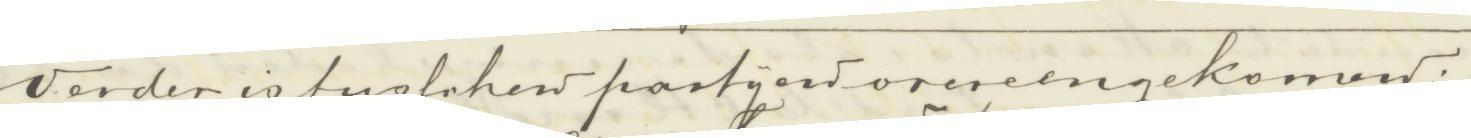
Verder is tusschen partijen overeengekomen:
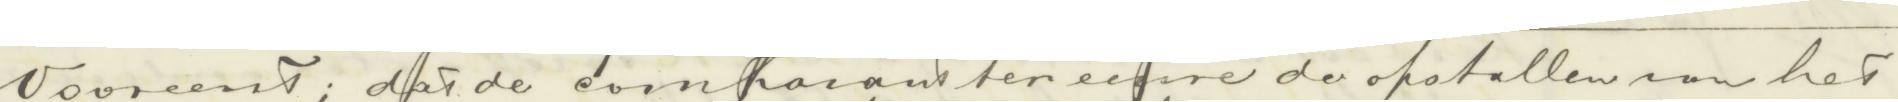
Vooreerst; dat de comparant ter eenre de opstallen van het
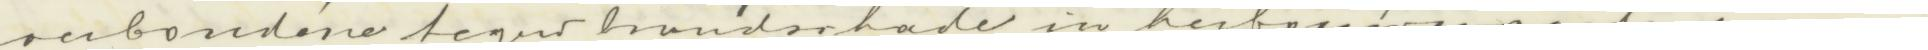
verbondene tegen brandschade in herbouwwaarde in eene
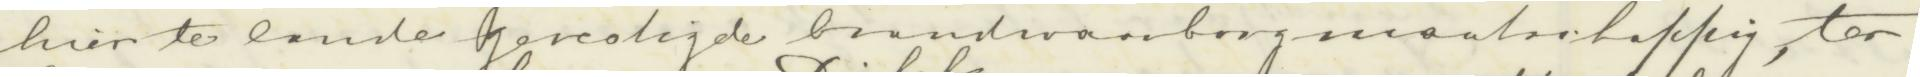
hier te lande gevestigde brandwaarborgmaatschappij, ter
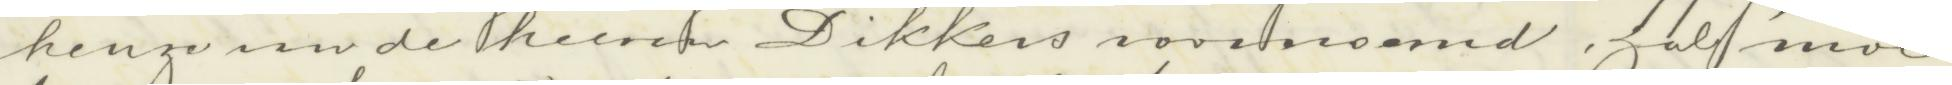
keuze van de heeren Dikkers voornoemd, zal moe.
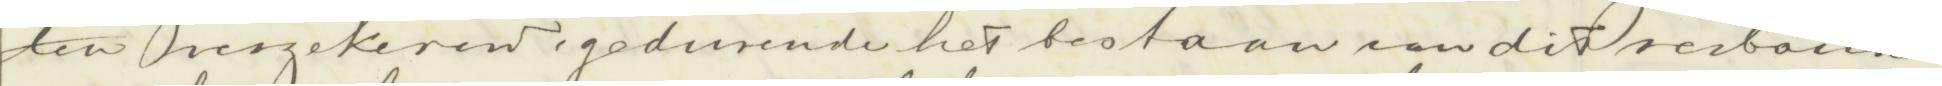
ten verzekeren, gedurende het bestaan van dit verband
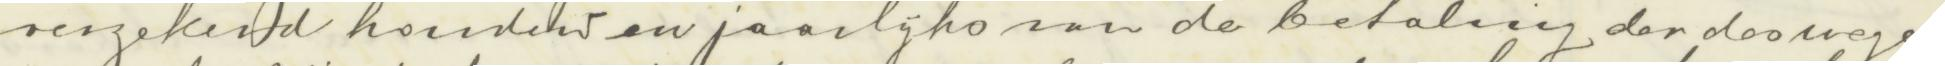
verzekerd houden en jaarlijks van de betaling der deswege
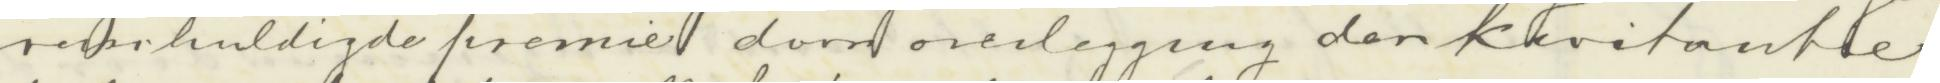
verschuldigde premie door overlegging der kwitante
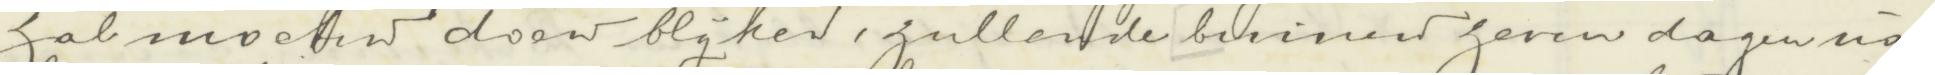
zal moeten doen blijken, zullende binnen zeven dagen na
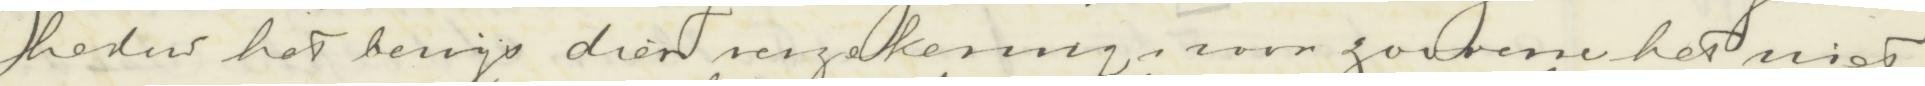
heden het bewijs dier verzekering, voor zooverre het niet
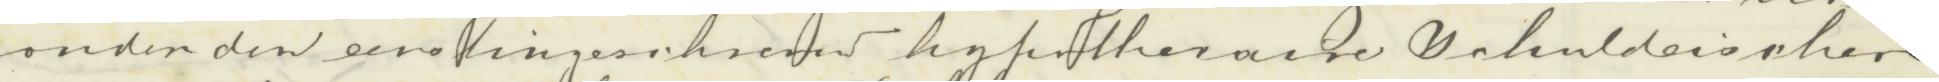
onder den eerst ingeschreven hypothecaire schuldeischer
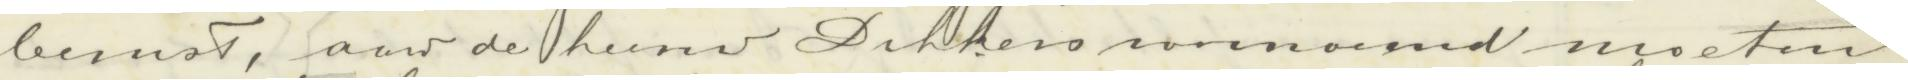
berust, aan de heeren Dikkers voornoemd moeten
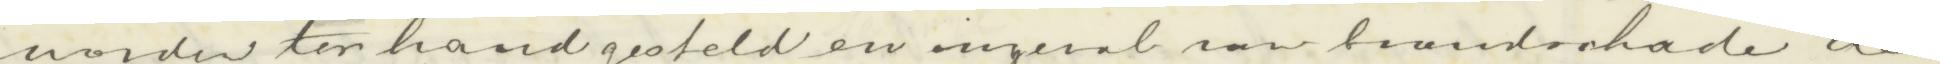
worden ter hand gesteld en ingeval van brandschade de
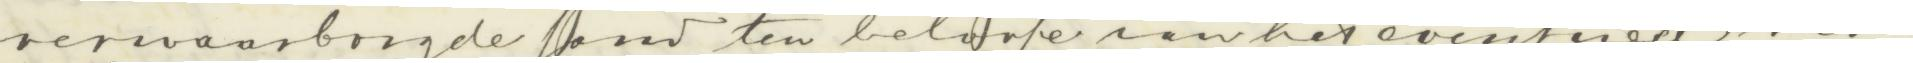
verwaarborgde som ten beloope van het eventueel ver.
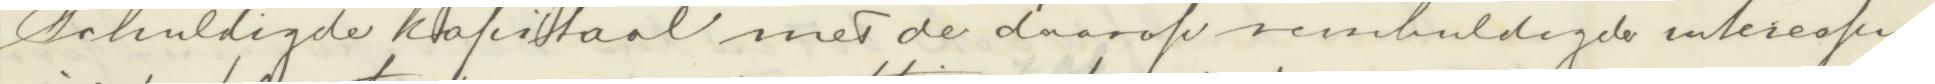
schuldigde kapitaal met de daarop verschuldigde interessen
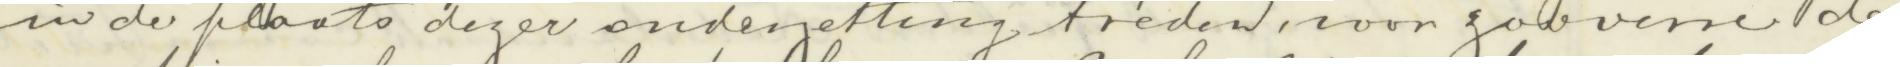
in de plaats dezer ondezetting treden, voor zooverre de
